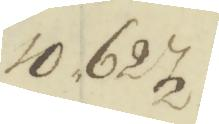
10„62½
